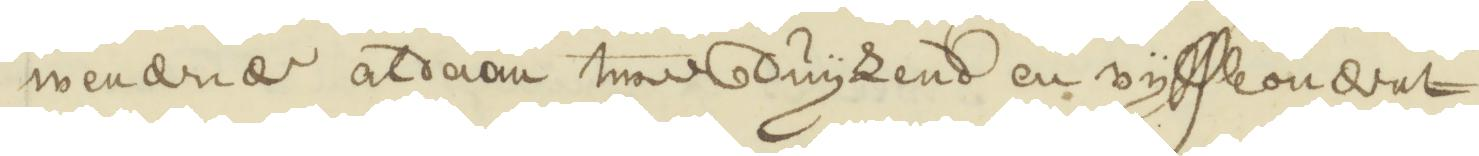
werdende aldaar twee duijzend en vijffhondert
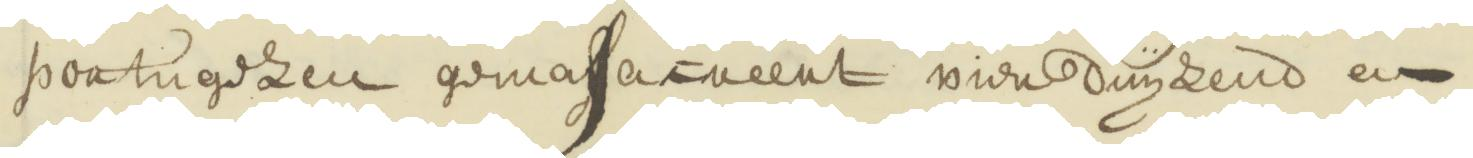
portugezen gemassacreert vier duijzend en
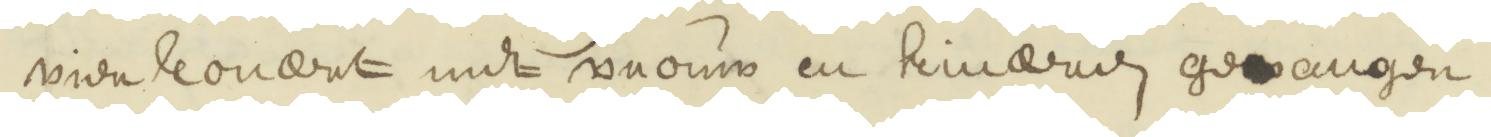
vier hondert met vrouw en kinderen gevangen
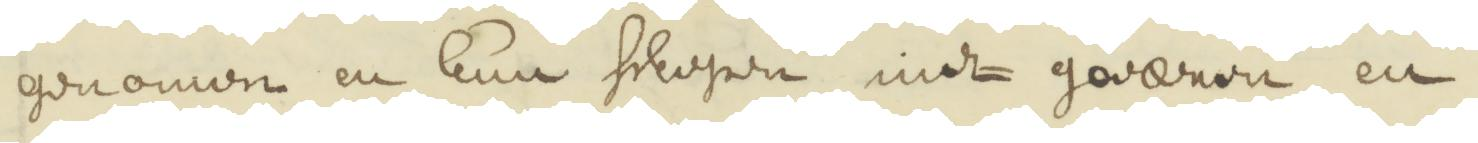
genomen en hun schepen met goederen en
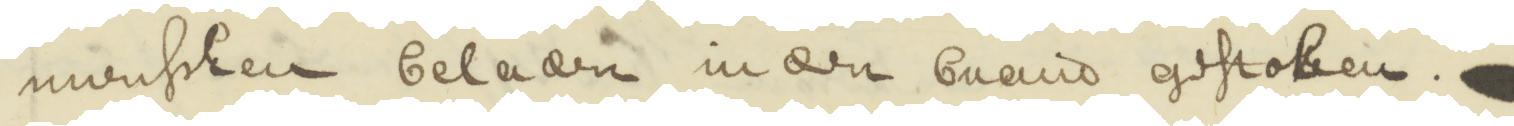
menschen beladen in den brand gestoken.
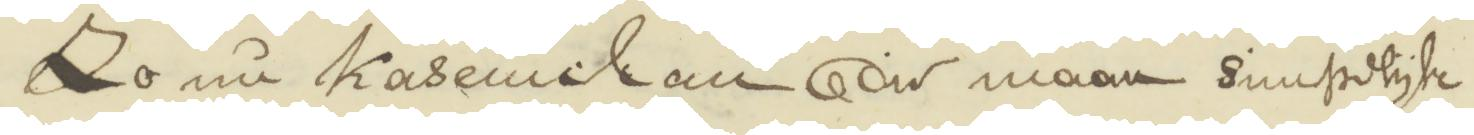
Zo nu kasemchan die maar simpelijk
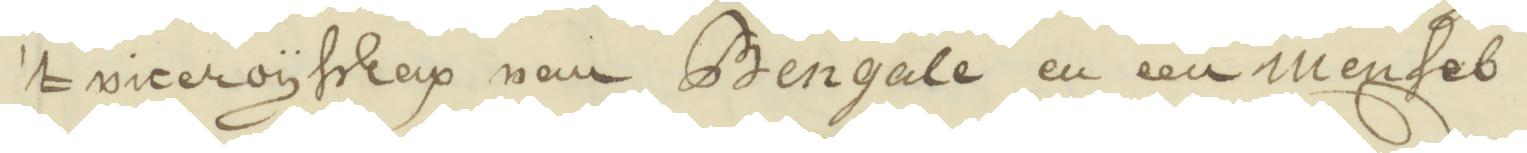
’t viceroijschap van Bengale en een menseb
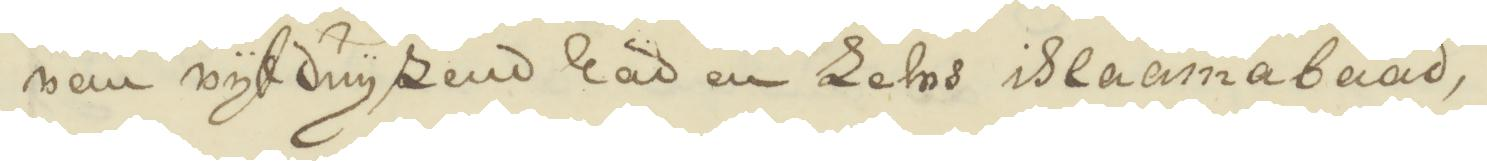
van vijf duijzend had en zelvs islaamabaad,
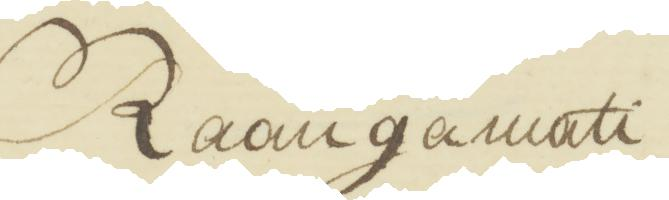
Raangamati
